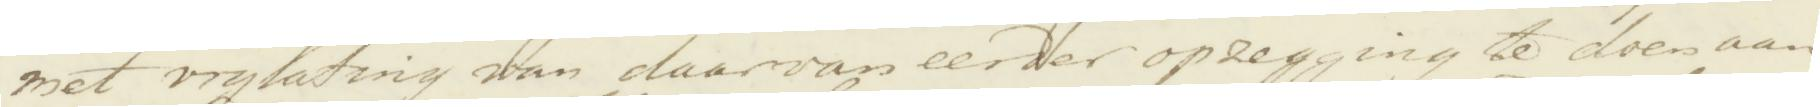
met vrylating van daarvan eerder opzegging te doen aan
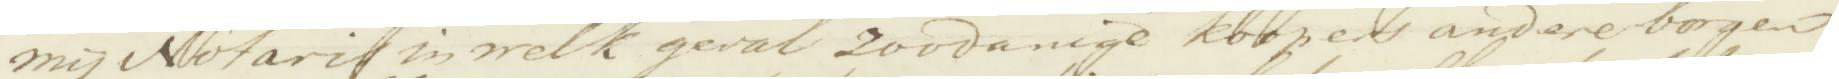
mij Notaris in welk geval zoodanige kooper andere borgen
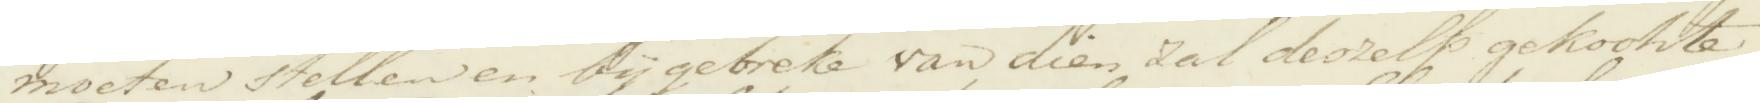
moeten stellen en bij gebreke van dien zal deszelf gekochte
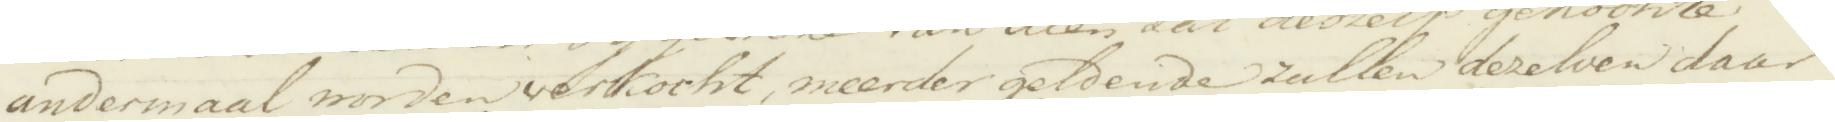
andermaal worden verkocht, meerder geldende zullen dezelven daar
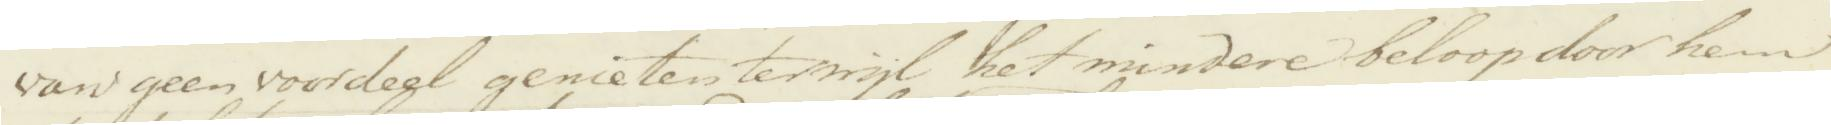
van geen voordeel genieten terwijl het mindere beloop door hem
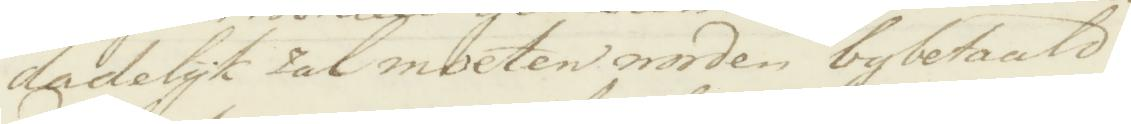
dadelijk zal moeten worden bybetaald
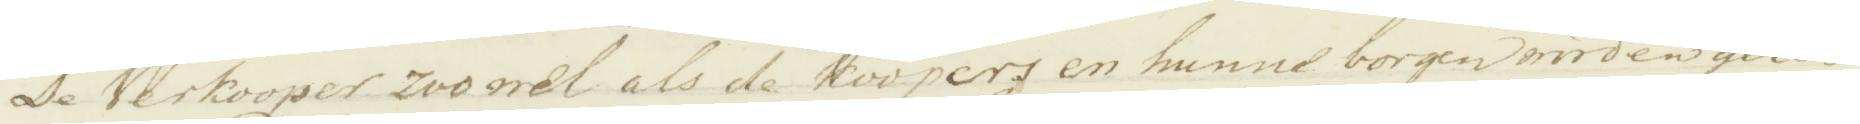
De Verkooper zoo wel als de koopers en hunne borgen worden gecon
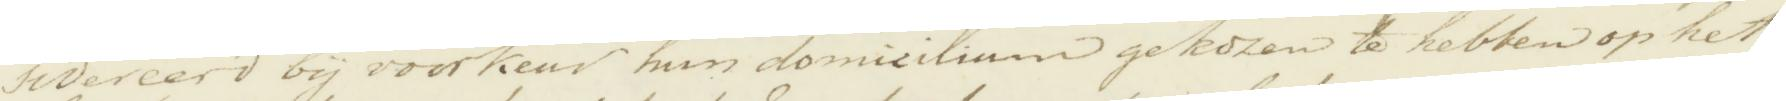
sidereerd bij voorkeur hun domicilium gekozen te hebben op het
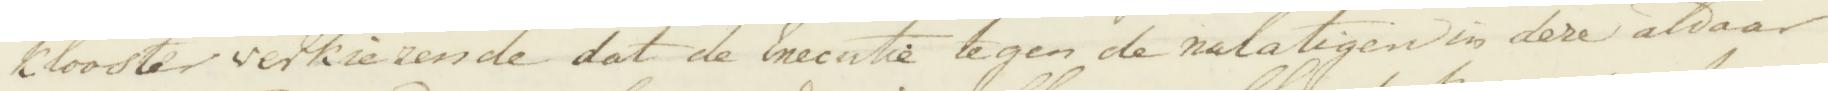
klooster verkiezende dat de Executie tegen de nalatigen in deze aldaar
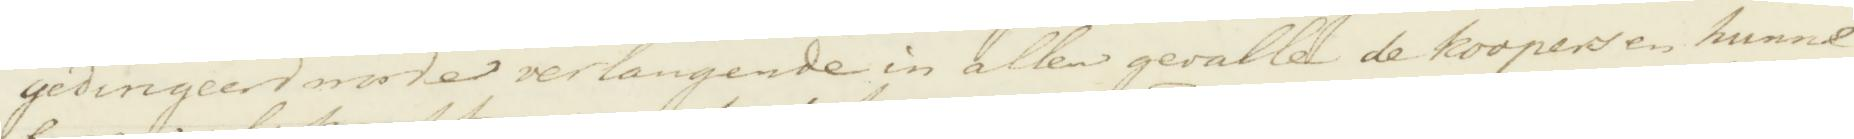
gedirigeerd worde verlangende in allen gevalle de koopers en hunne
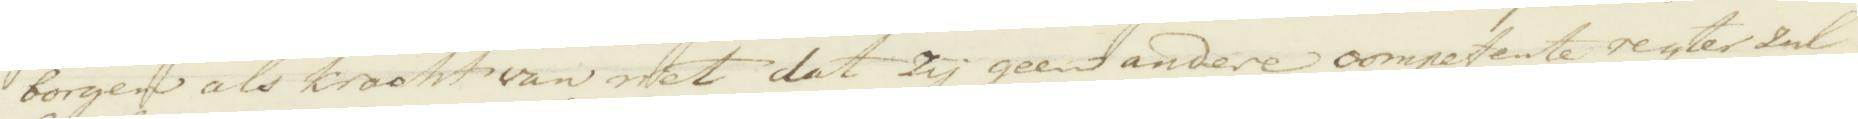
borgen als kracht van wet dat zij geen andere competente regter zul
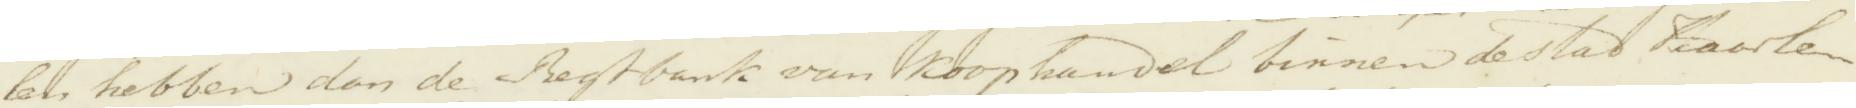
len hebben dan de Regtbank van Koophandel binnen de stad Haarlem
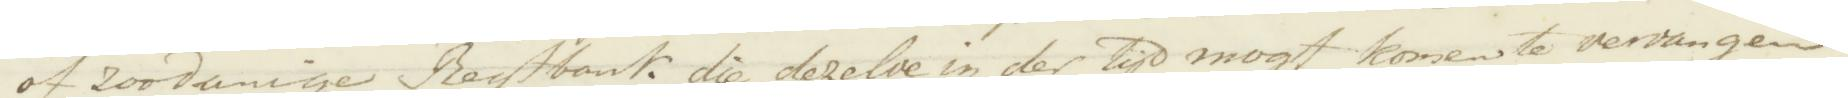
of zoodanige Regtbank die dezelve in der tijd mogt komen te vervangen
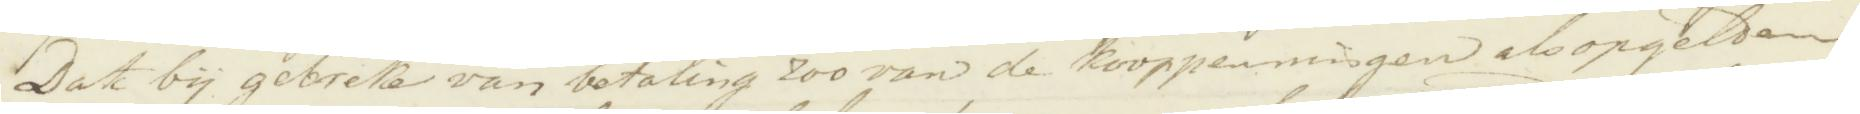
Dat bij gebreke van betaling zoo van de kooppenmingen als opgelden
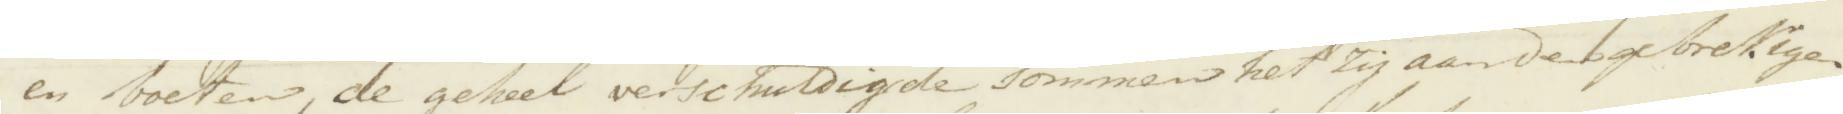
en boeten, de geheel verschuldigde sommen het zij aan de gebrekige
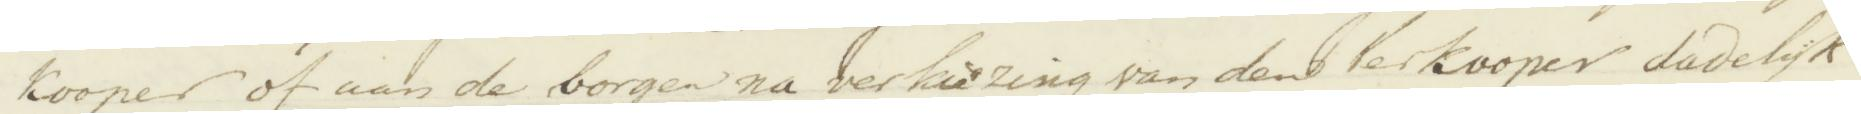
kooper of aan de borgen na verkiezing van den Verkooper dadelijk
